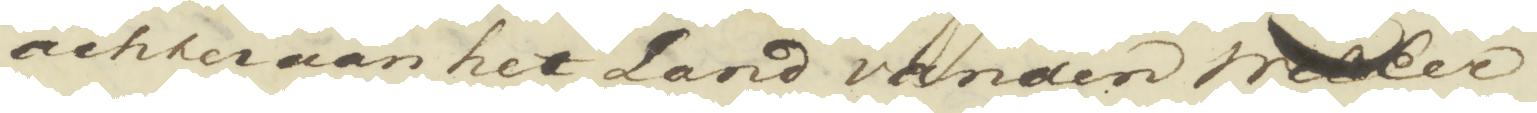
achter aan het land van den Wilker
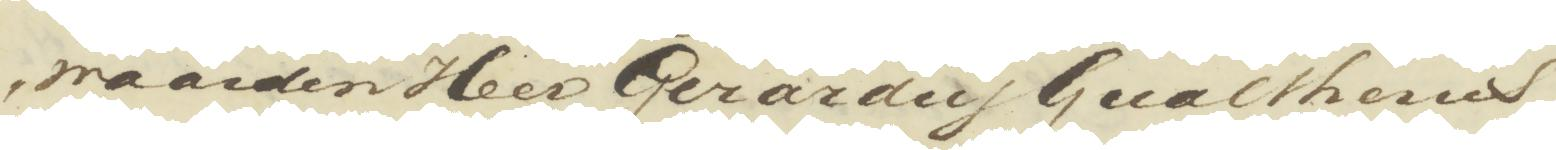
„waarden Heer Gerardus Gualtherus
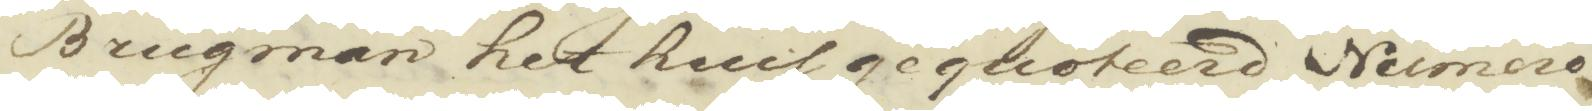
Brugman het huis gequoteerd Numero
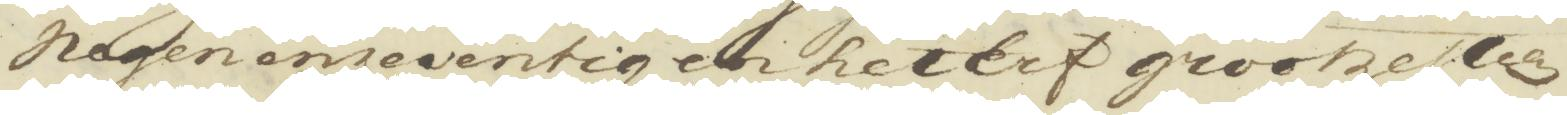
negenenzeventig en het Erf groot zestien
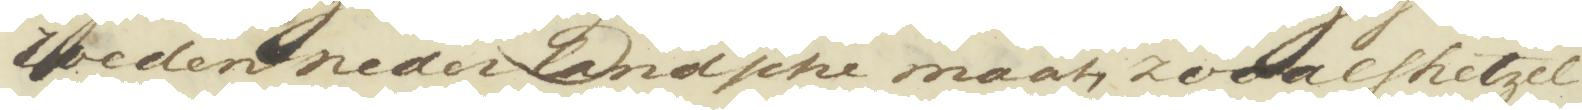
roeden nederlandsche maat, zoo als hetzel
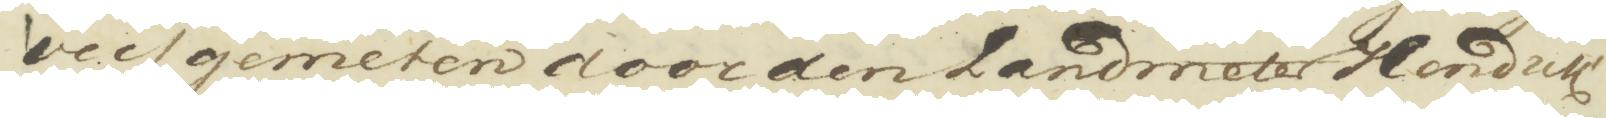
ve is gemeten door den landmeter Hendrik
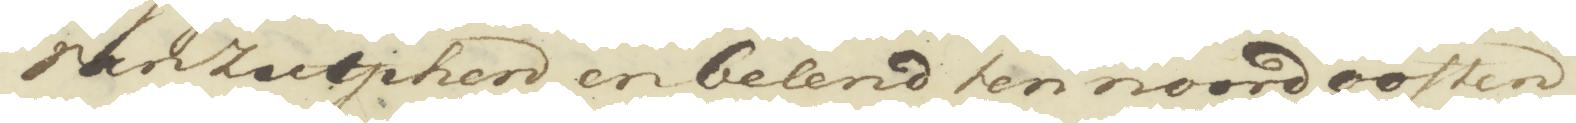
van zutphen en belend ten noordoosten
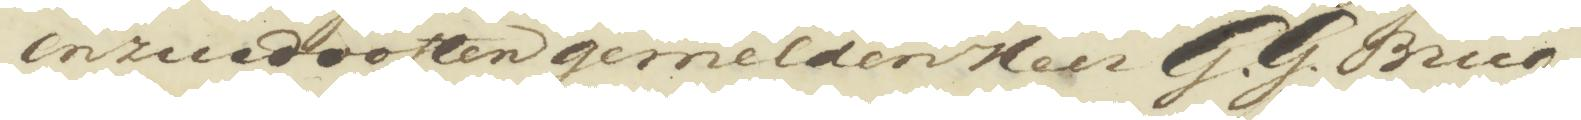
en zuidoosten gemelden Heer G. G. Brug
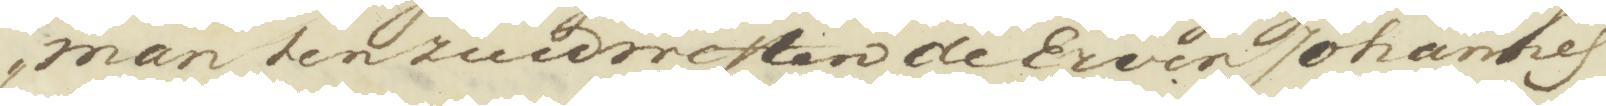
„man, ten zuidwesten de Erven Johannes
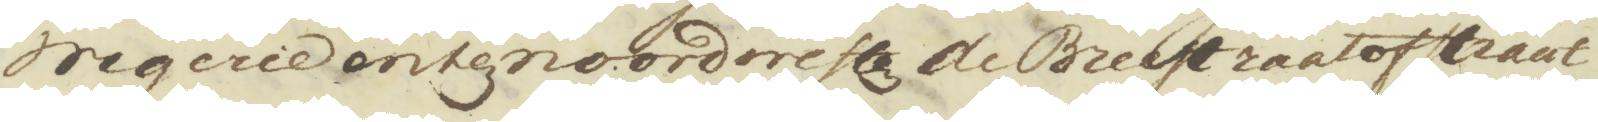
wigerie en ten noordwesten de Breestraat of straat
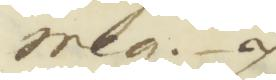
weg.-
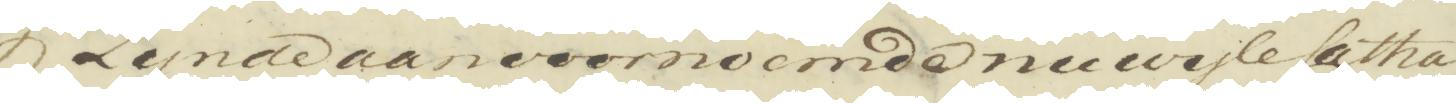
Zynde aan voornoemde nu wijle Catha
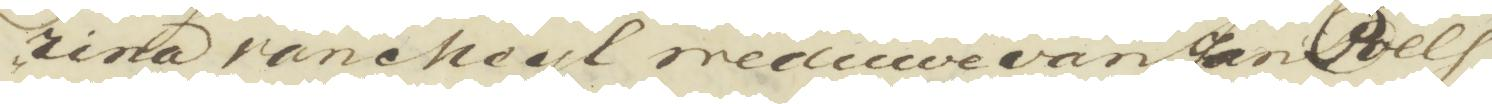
„rina van Meyl weduwe van Jan Poels
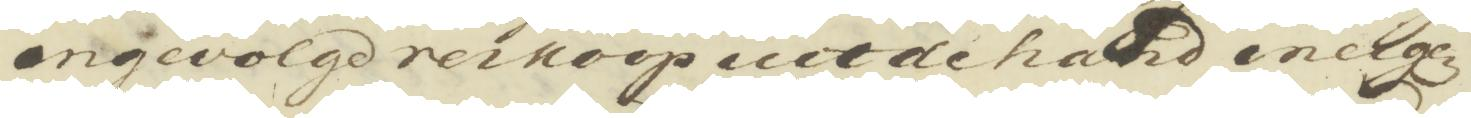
ingevolge verkoop uit de hand en eigen
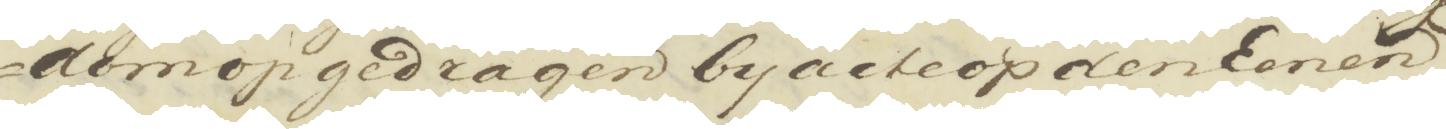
=dom opgedragen by acte op den Eenen
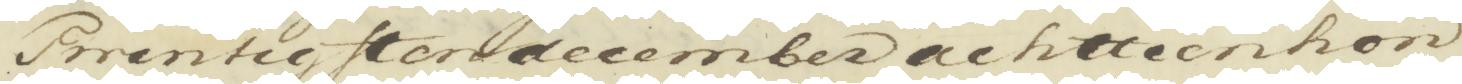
Twintigsten december achttienhon
